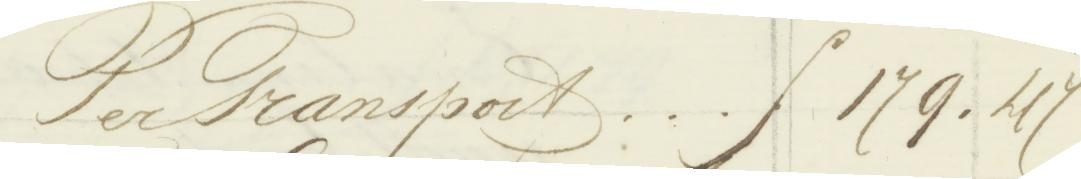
Per Transport . . . ƒ 179„47
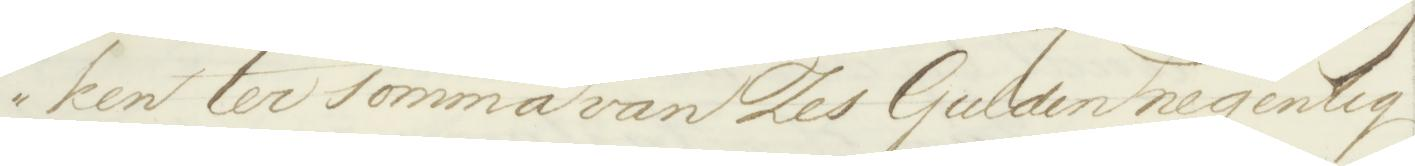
„ken ter somma van Zes Gulden negentig
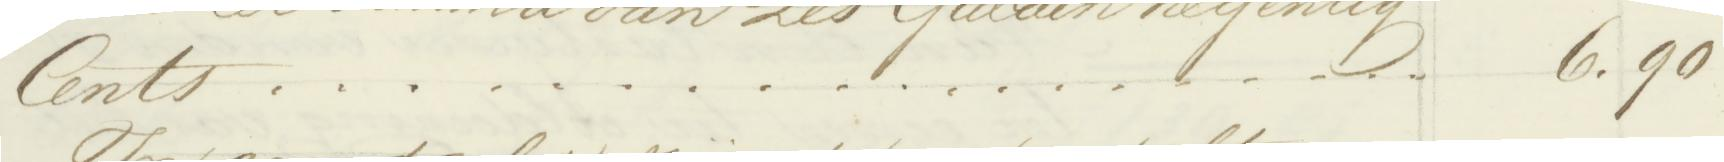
Cents. . . . . . . . . . . . . . . - - . .. 6.90
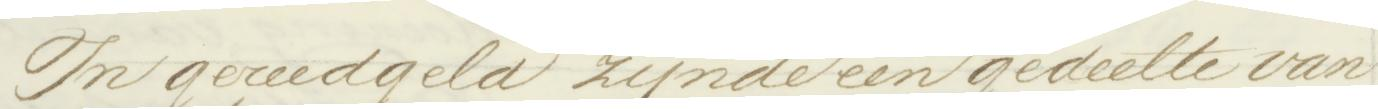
In gereed geld zynde een gedeelte van
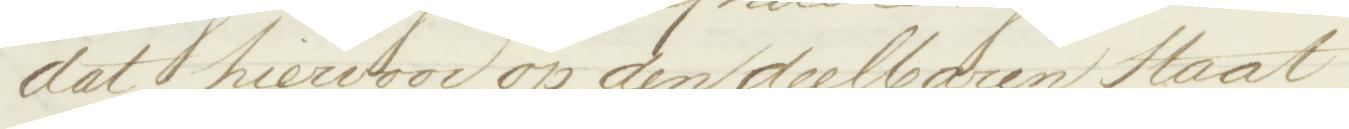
dat hiervoor op den deelbaren staat
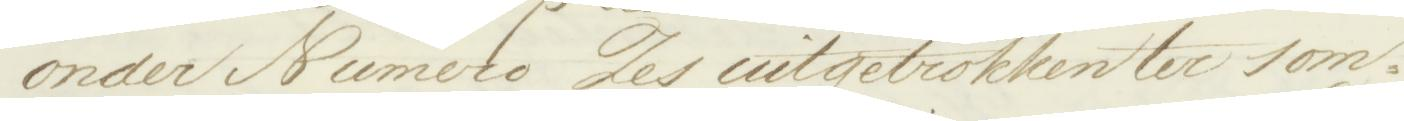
onder Numero Zes uitgetrokken ter som„
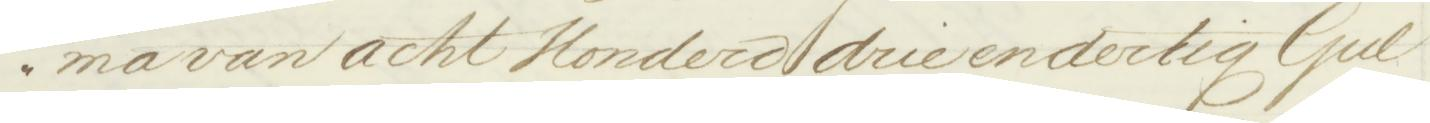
„ ma van acht Honderd drie en dertig Gul
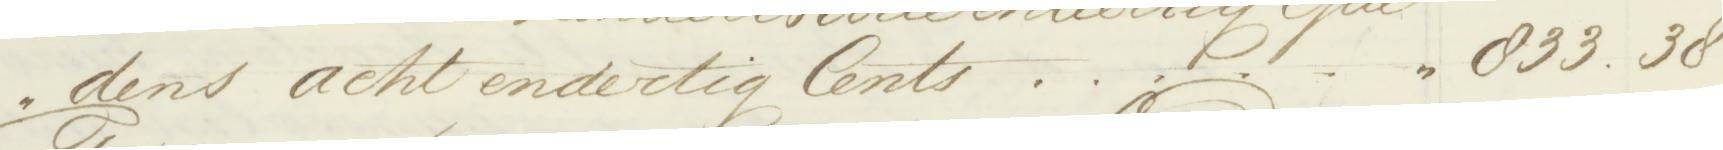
„ dens acht endertig Cents . . . . . „ 833. 38
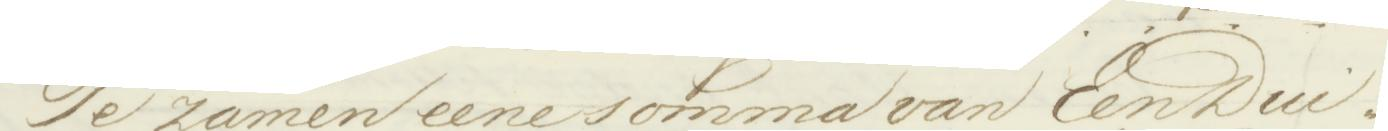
Te zamen eene somma van Een Dui„
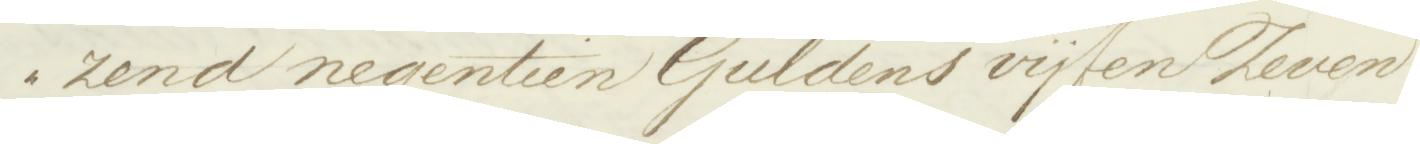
„ zend negentien Guldens vijfen Zeven
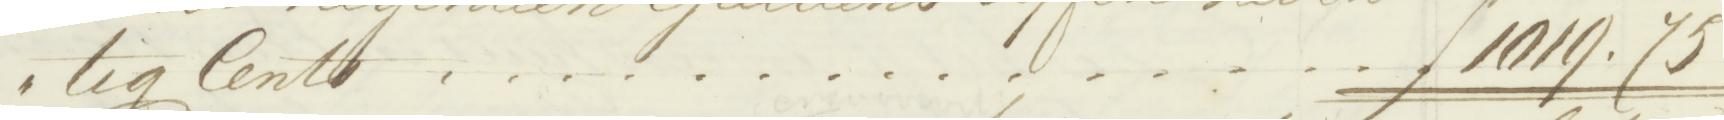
„ tig Cents , , . . . . . . . . - - - - . ƒ1019.75
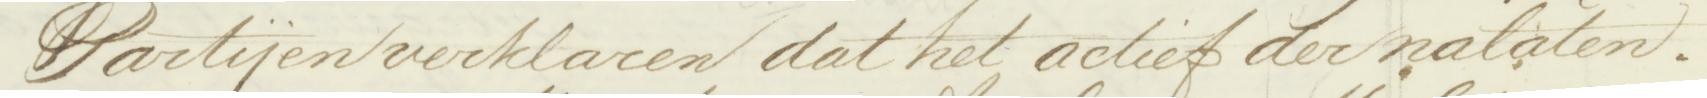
Partijen verklaren dat het actief der nalaten.
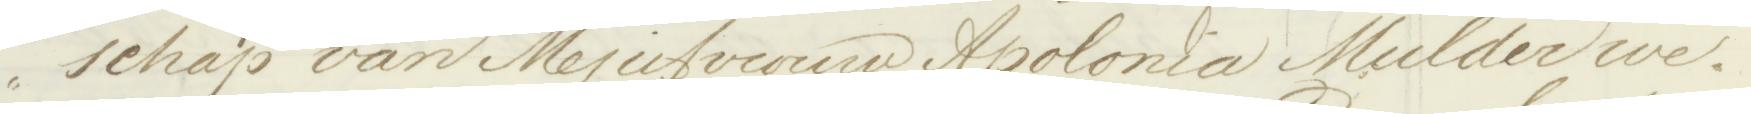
„ schap van Mejufvrouw Apolonia Mulder we,
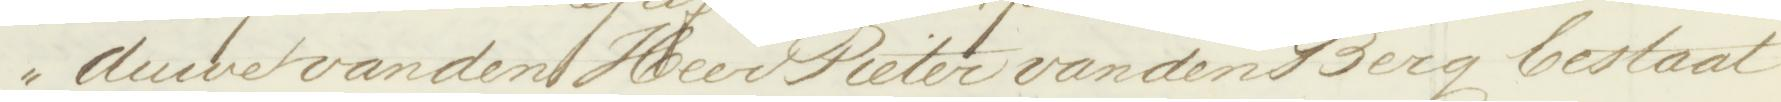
„ duwe van den Heer Pieter van den Berg bestaat
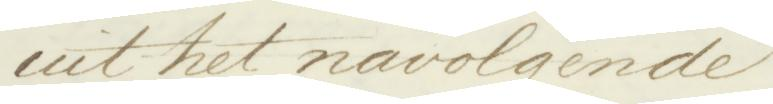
uit het navolgende
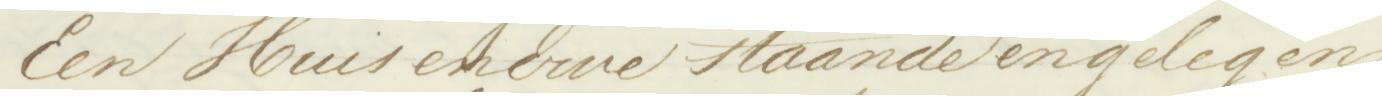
Een Huis en Erve staande en gelegen
